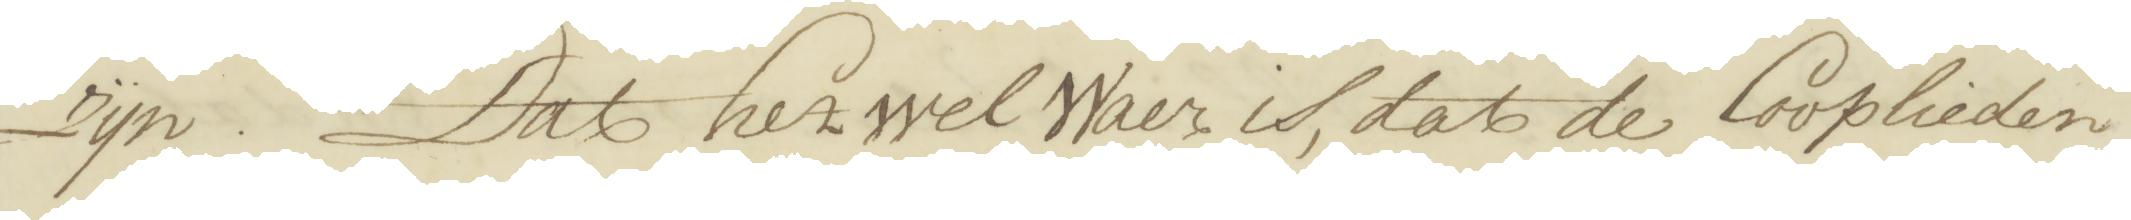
zijn. Dat het wel waer is, dat de Cooplieden
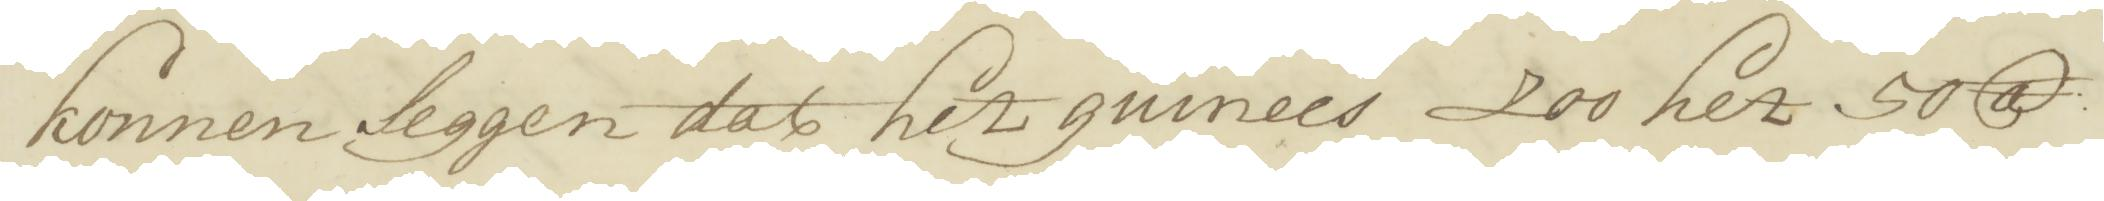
konnen seggen dat het guinees zoo het 50 @
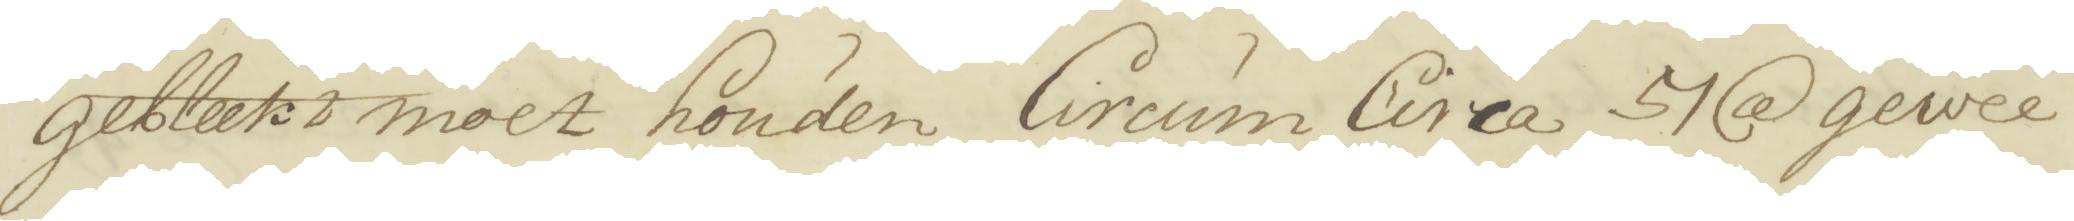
gebleekt moet houden, Circum Circa 51@ gewee
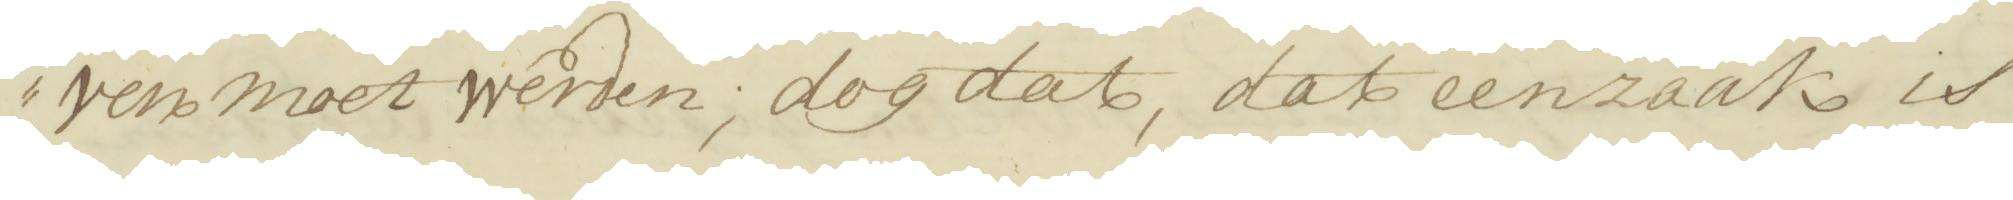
„ven moet werden; dog dat, dat eenzaak is
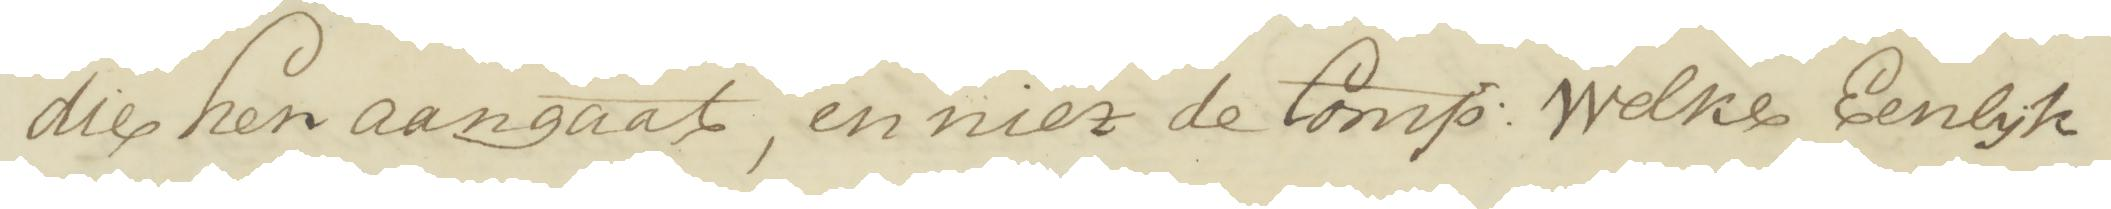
die hen aangaat, en niet de Comp: welke Eenlijk
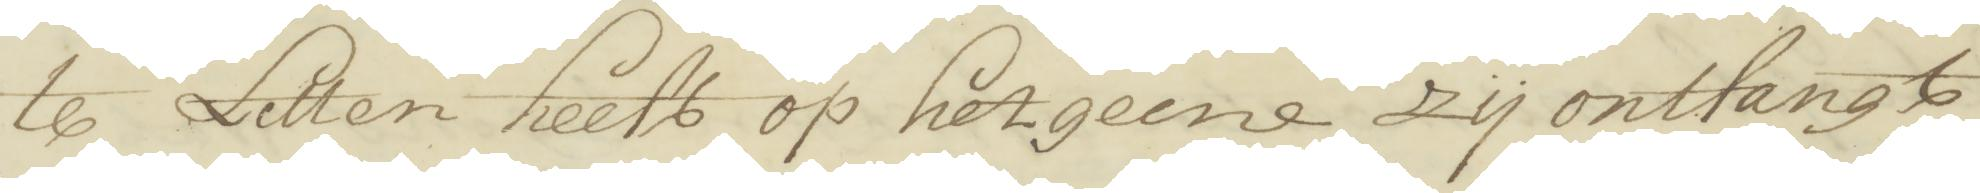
te Letten heeft, op het geene zij ontfangt
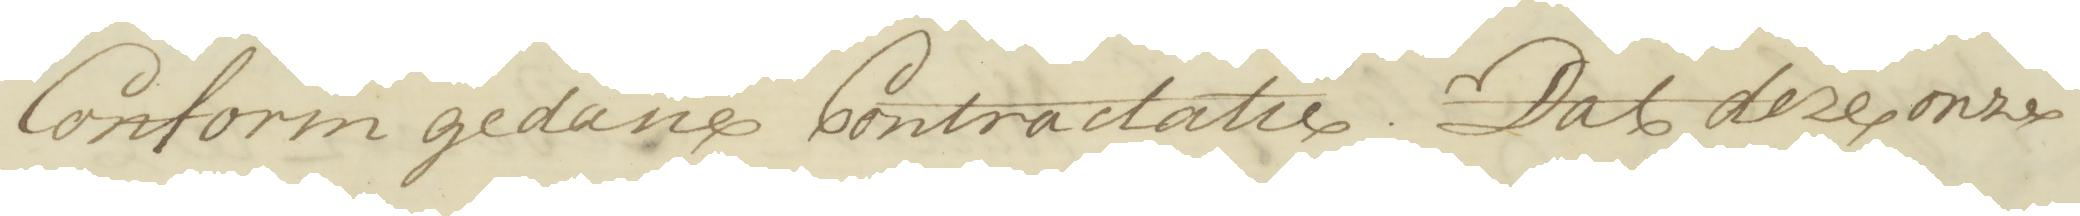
Conform gedane Contractatie. Dat deze onze
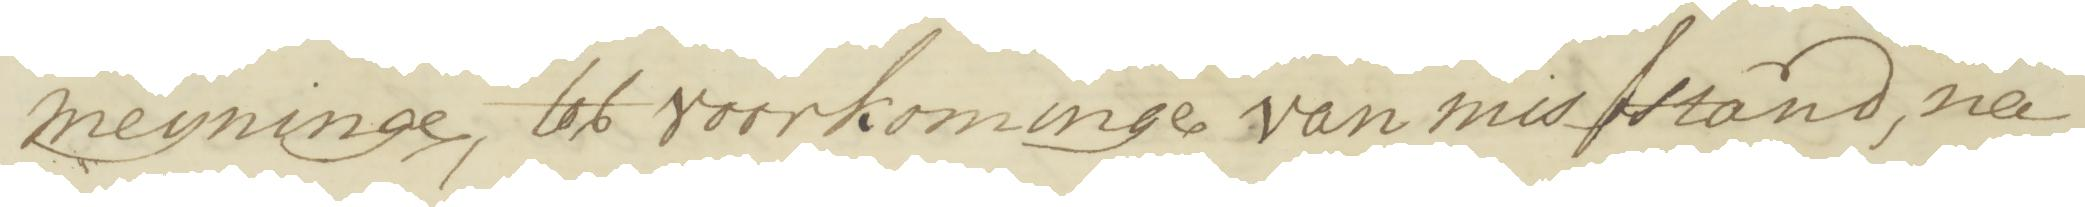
meijninge, tot voorkominge van misverstand, na
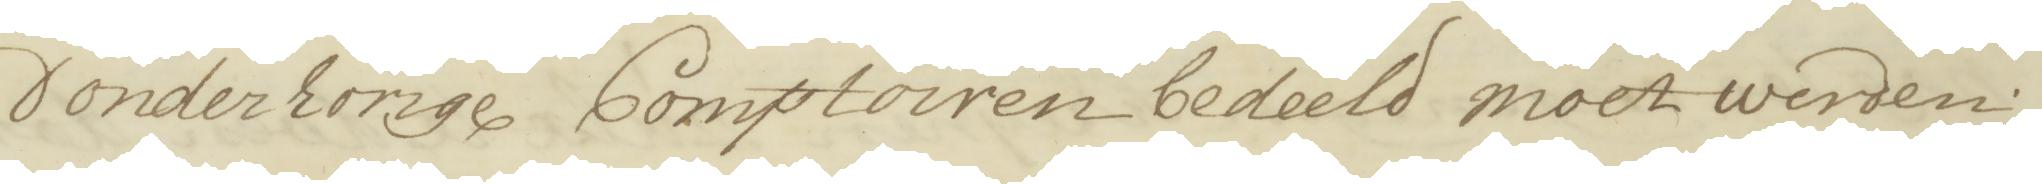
d onderhorige Comptoiren bedeeld moet werden;
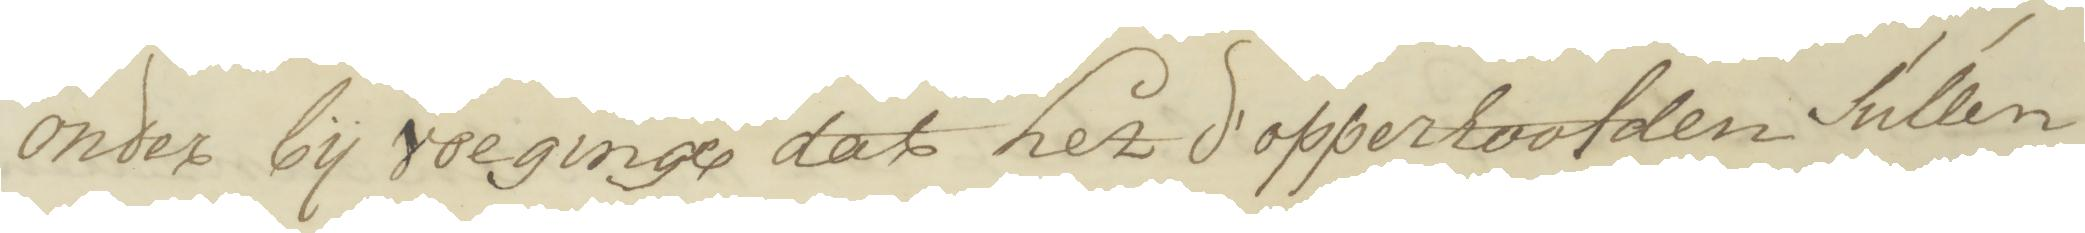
onder bij voeginge dat het d’opperhoofden sullen
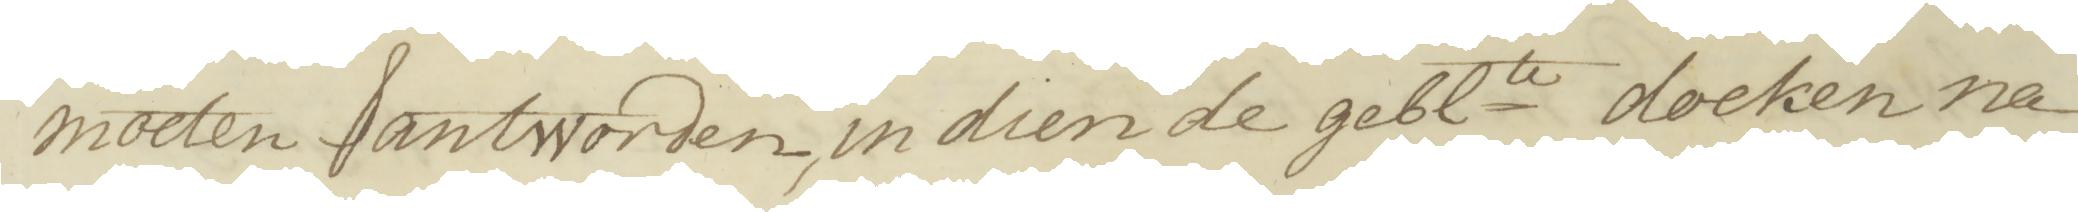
moeten verantworden, in dien de gebl=te doeken na
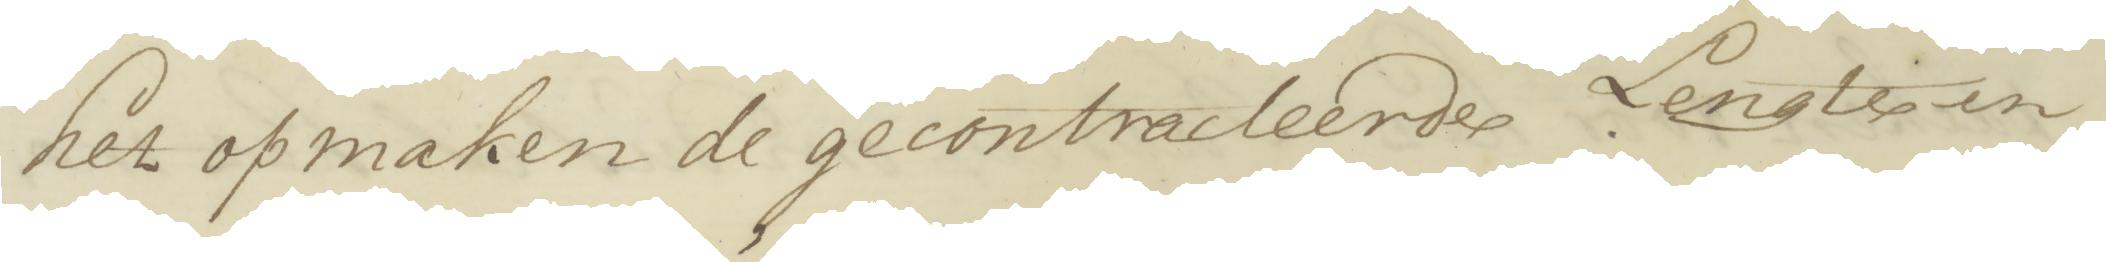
het op maken de gecontracteerde Lengte en
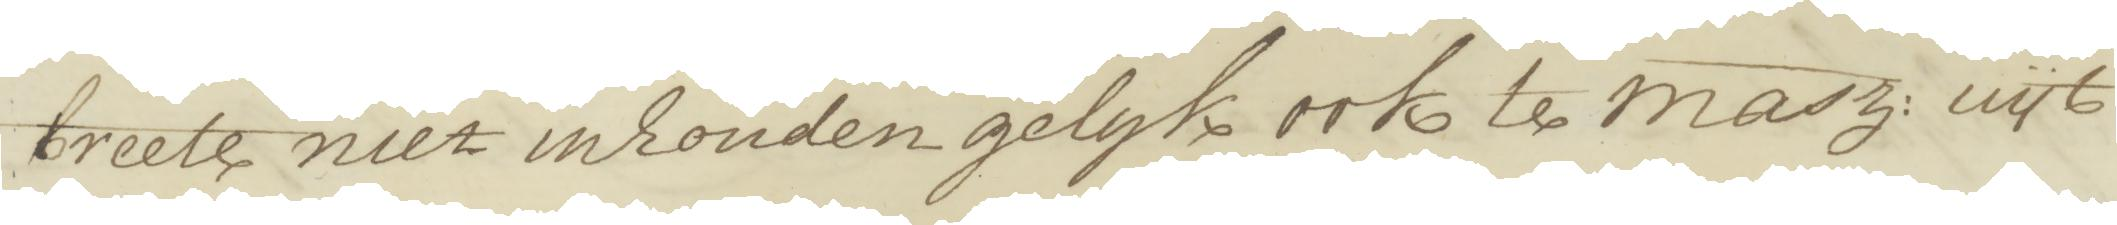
breete niet inhouden gelijk ook te masz: uijt
